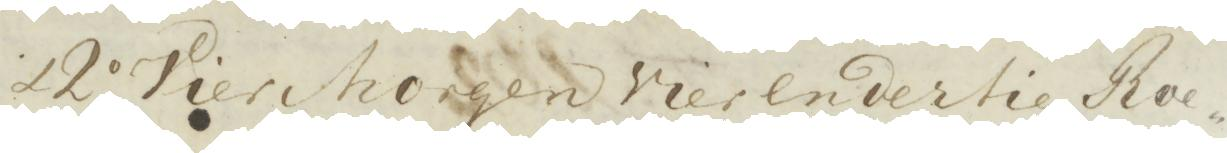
12.o Vier Morgen Vier en dertig Roe„
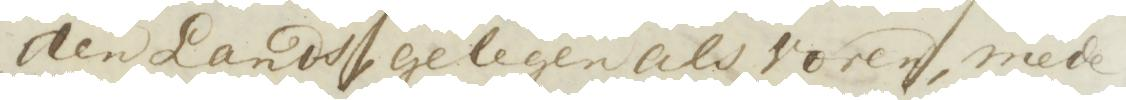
den Lands gelegen als voren, mede
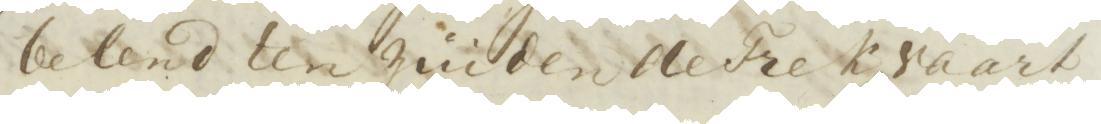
belend ten zuiden de Trekvaart
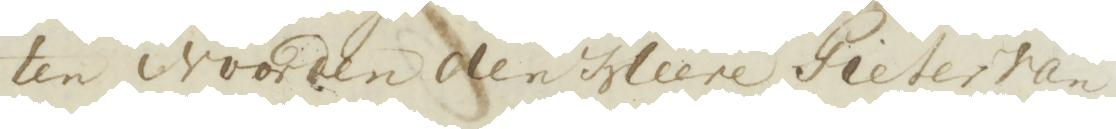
ten Noorden den Heere Pieter van
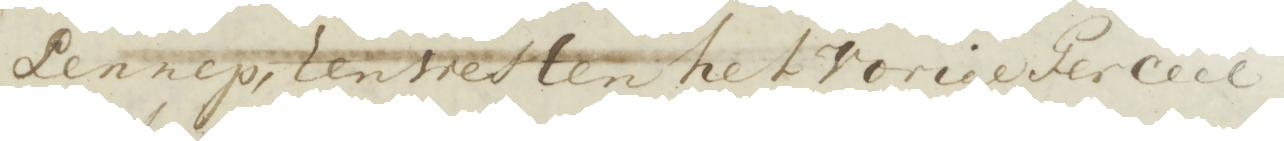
Lennep, ten westen het vorige Perceel
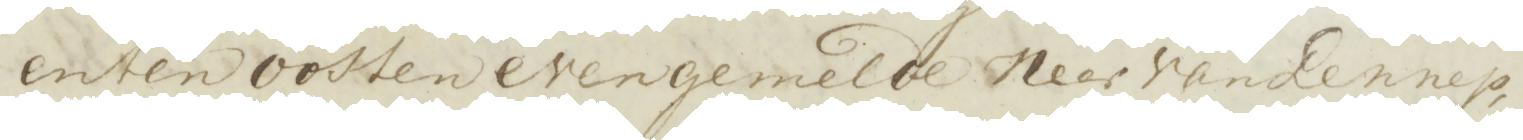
en ten oosten even gemelde Heer van Lennep,
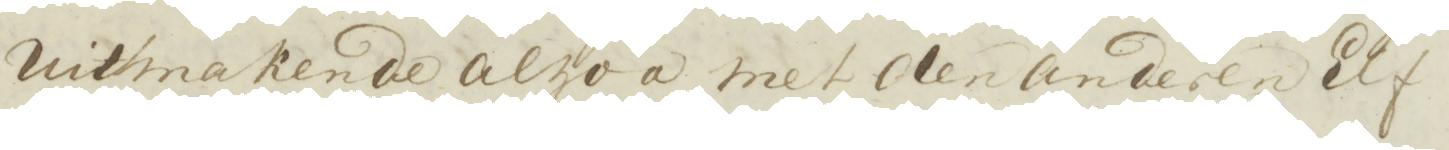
uitmakende alzoo met den anderen Elf
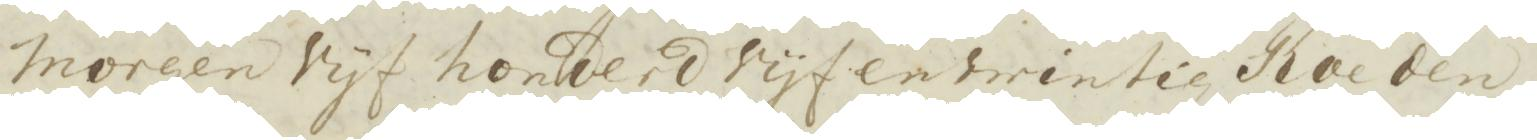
morgen Vijf honderd vijf en twintig Roeden,
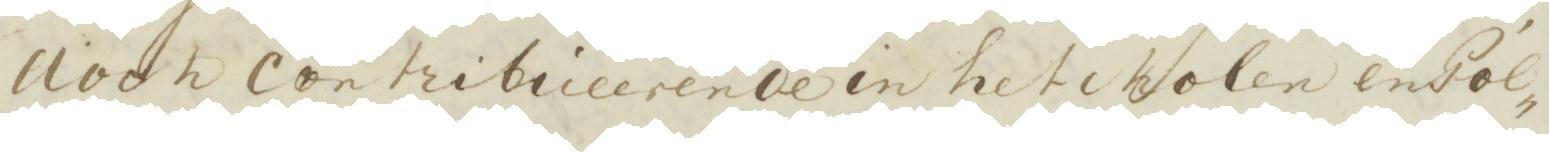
doch contribueerende in het Molen en Pol„
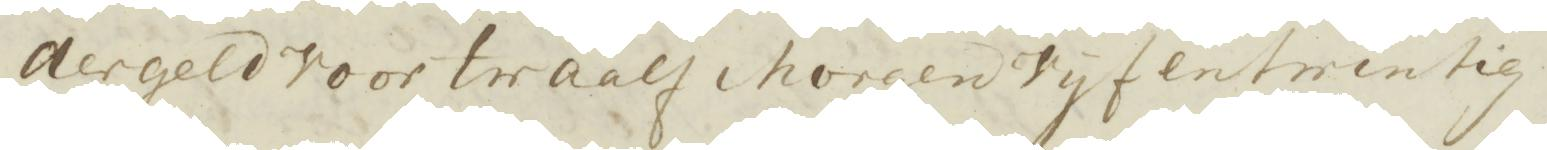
dergeld voor twaalf Morgen vijfentwintig
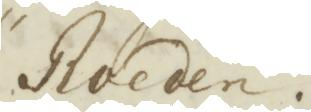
Roeden.
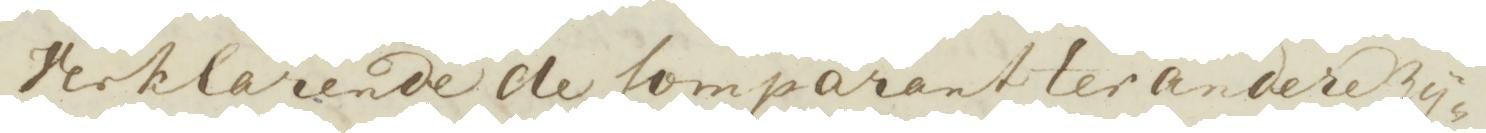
Verklarende de Comparant ter andere zij„
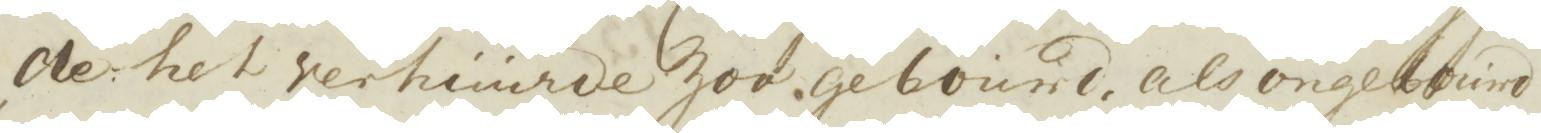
„de het verhuurde zoo, gebouwd, als ongebouwd
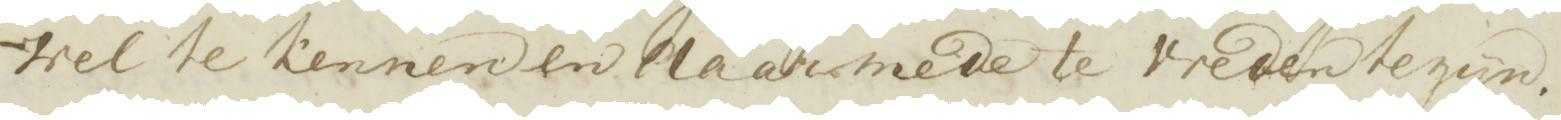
wel te kennen en daarmede te vreden te zijn.
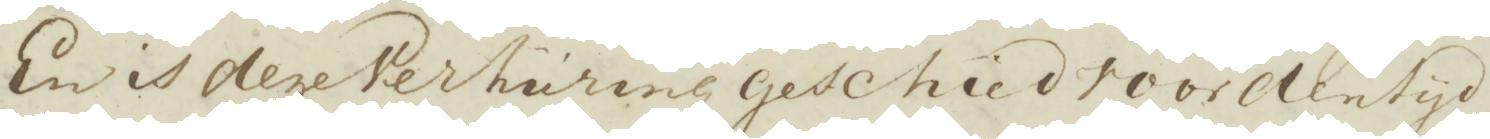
En is deze verhuring geschied voor den tijd
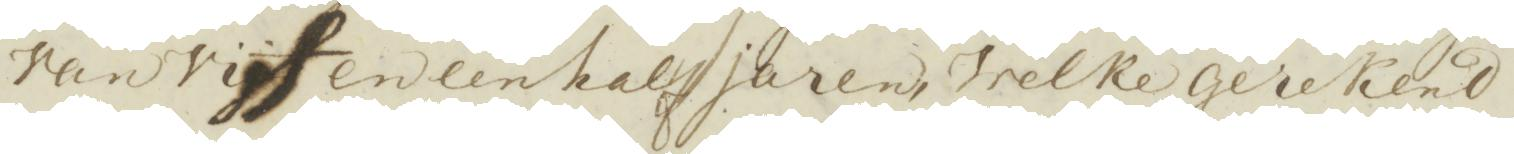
van vijf en een half jaren, welke gerekend
